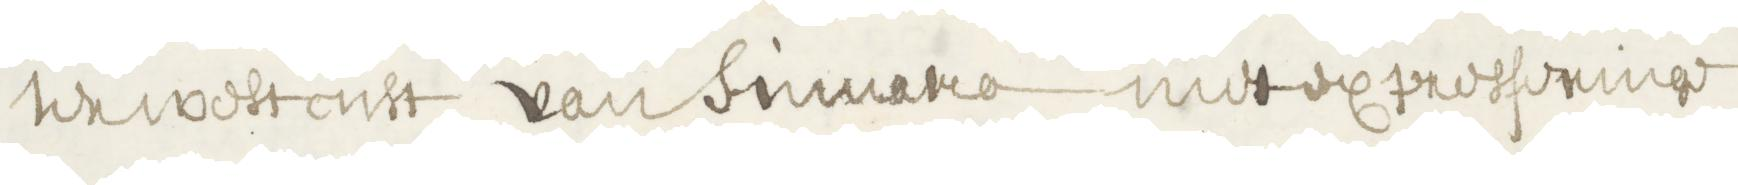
ter westcust van Sumatra met expresseringe
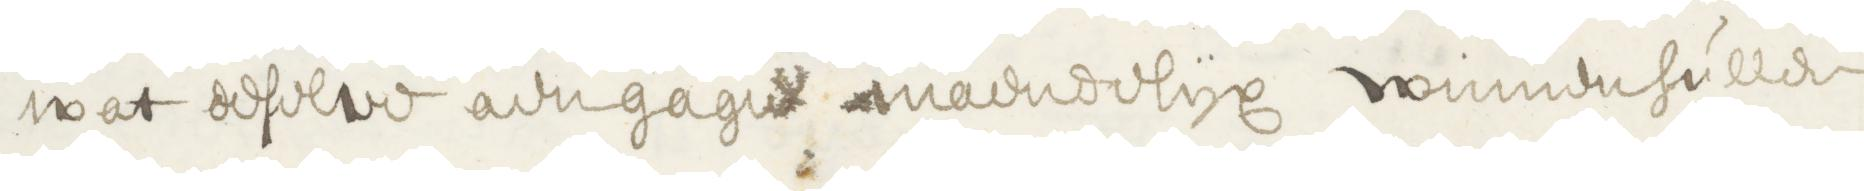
wat deselve aen gagie maendelijx winnen sullen
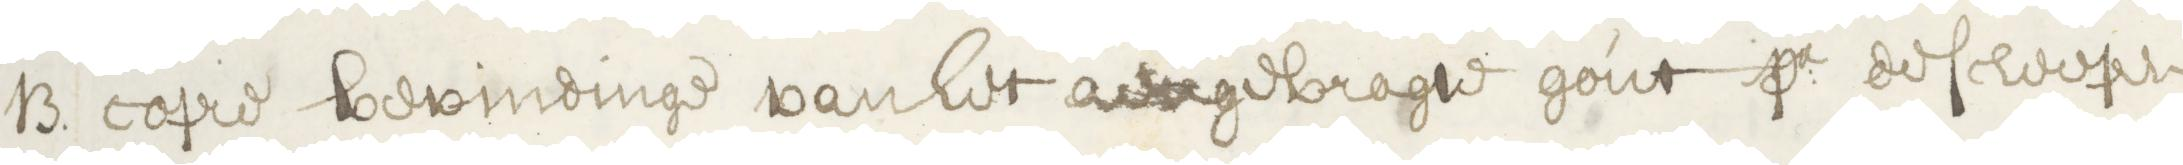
13. copie bevindinge van het aengebragte gout p:r de scheepen
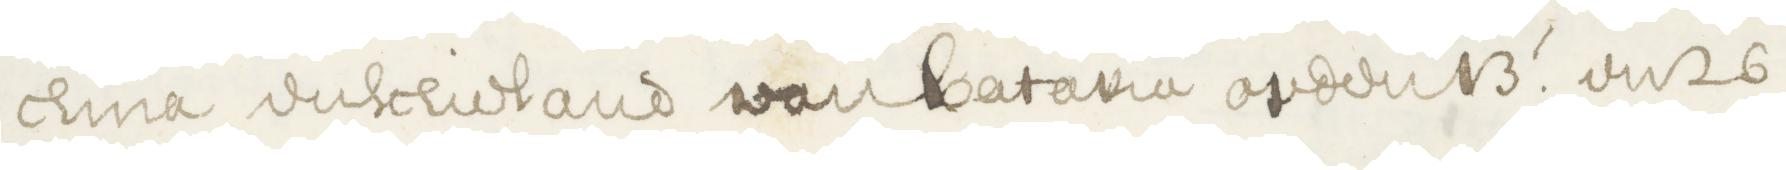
china en schieland van batavia op den 13.' en 26
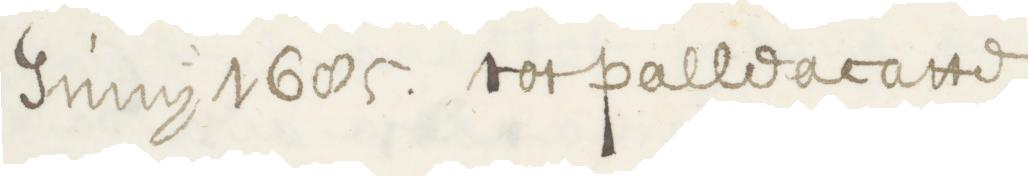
Junij 1685. tot palleacatte
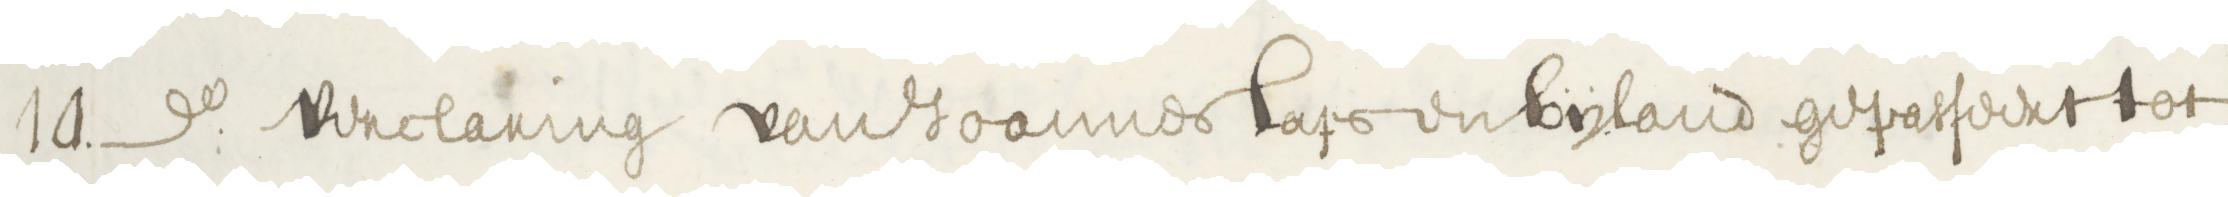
14. d:o Verclaring van Ioannes Laps en bijland gepasseert tot
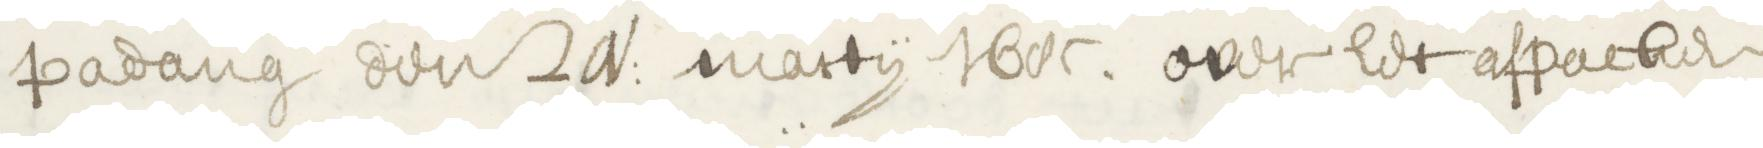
padang den 24: martij 1685. over het afpacken
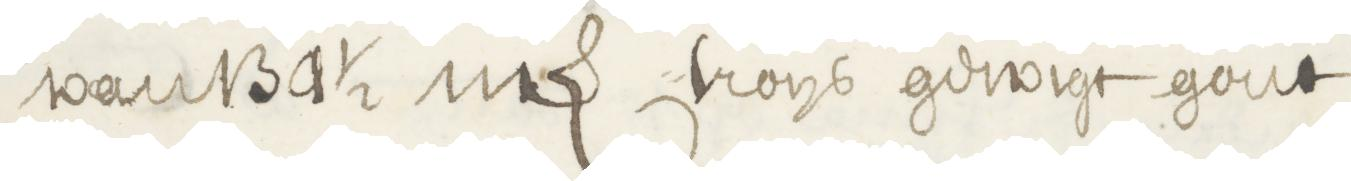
van 13 4½ m&=troijs gewigt gout
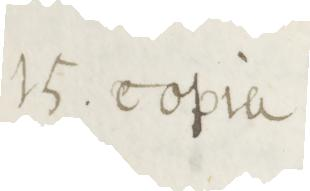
15. copia
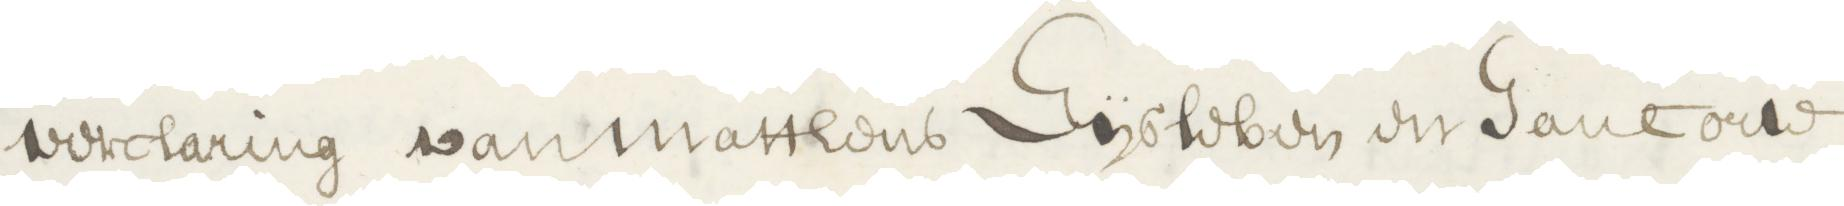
verclaring van mattheus Eijsleben en Ian corte
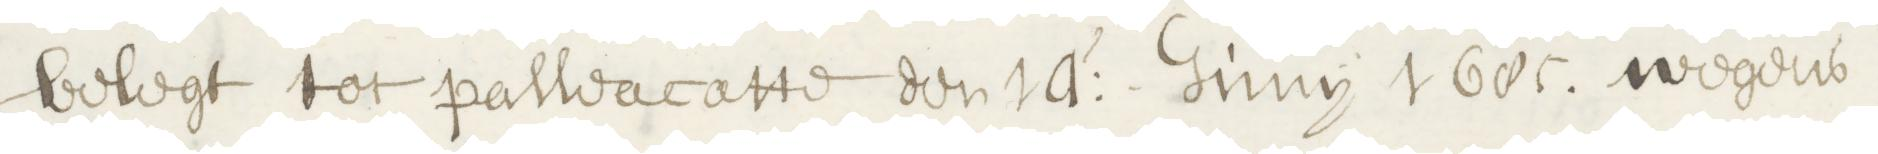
belegt tot palleacatte den 14:' Junij 1685. wegens
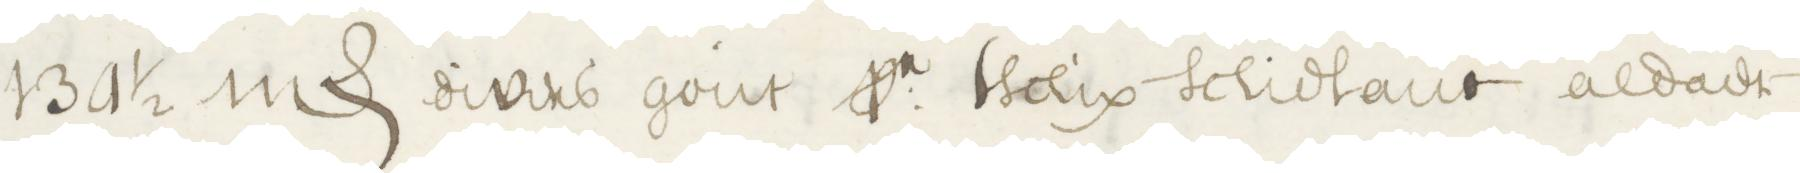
134½ m& divers gout p:r t schip schielant aldaer
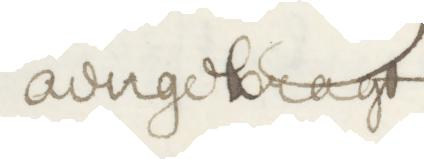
aengebragt
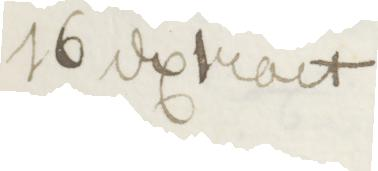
16 extract
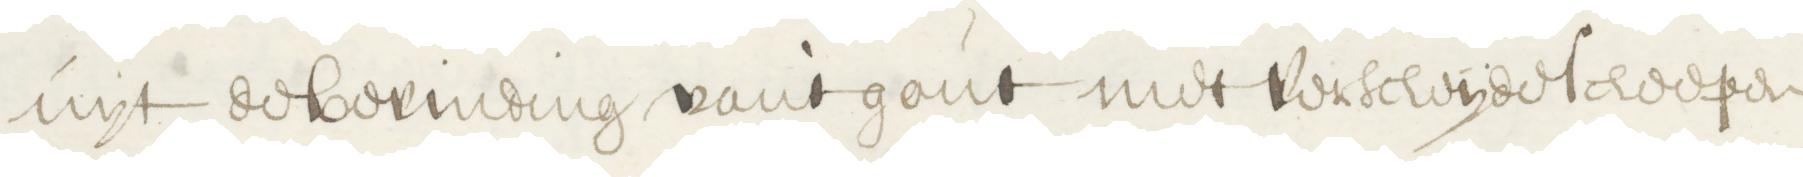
uijt de bevinding van ’t gout met verscheijde scheepen
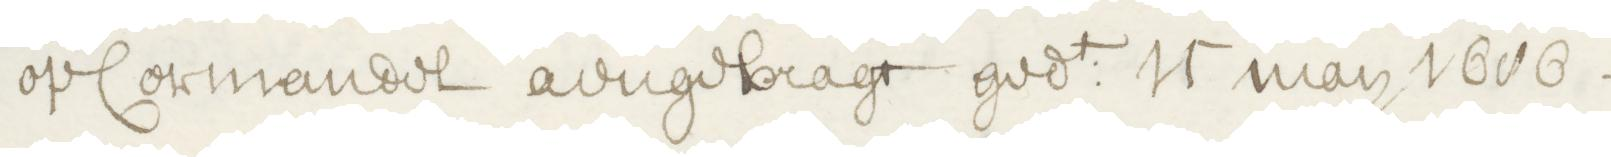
op cormandel aengebragt ged:t 15 may 1686
